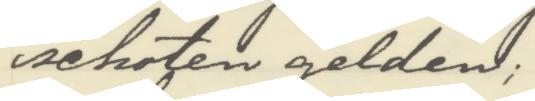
schoten gelden;
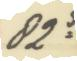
82=5
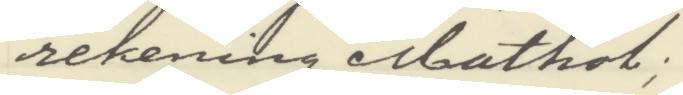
rekening Mathot:
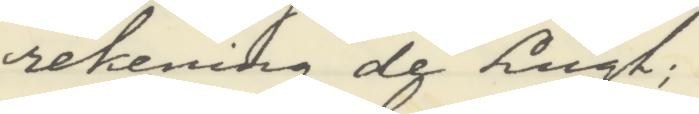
rekening de Lugt;
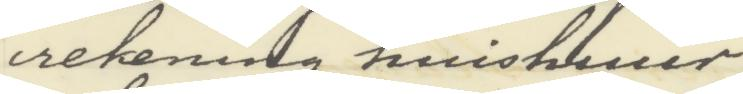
rekening huishuur
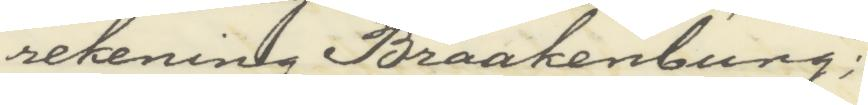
rekening Braakenburg;
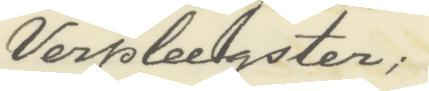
Verpleegster;
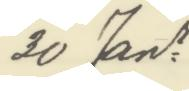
20 Jan=r
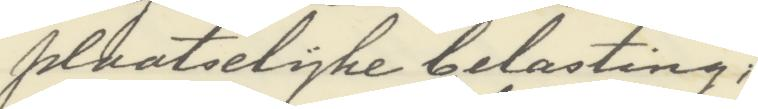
plaatselijke belasting;
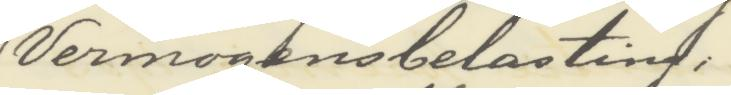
Vermogensbelasting.
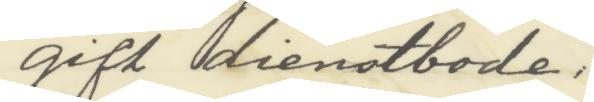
gift dienstbode;
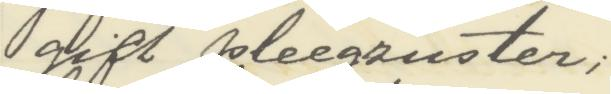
gift pleegzuster;
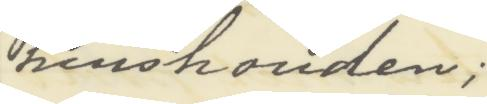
huishouden;
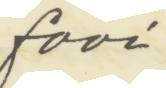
fooi
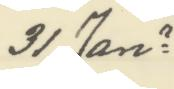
31 Jan=r
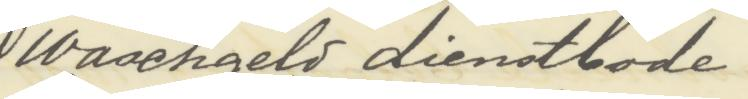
Waschgeld dienstbode
